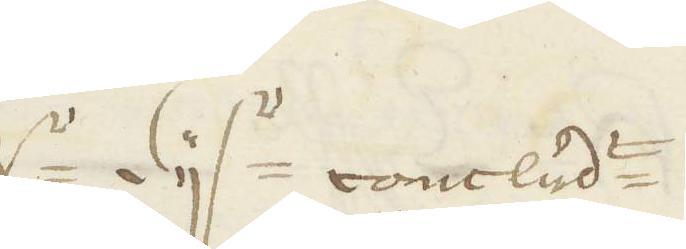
D' H=r Eijs=r conclud=t
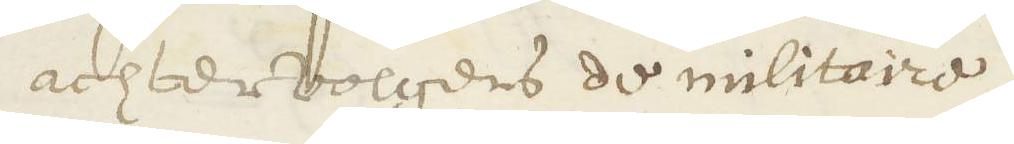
achtervolgens de militaire
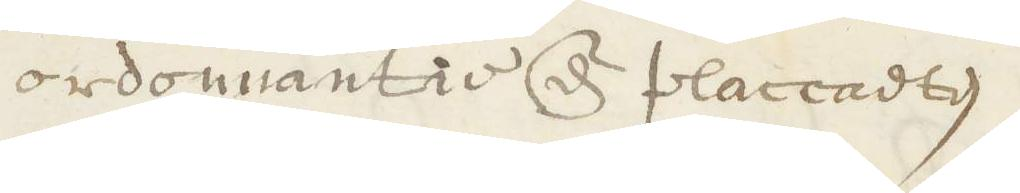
ordonnantie ende placcaeten
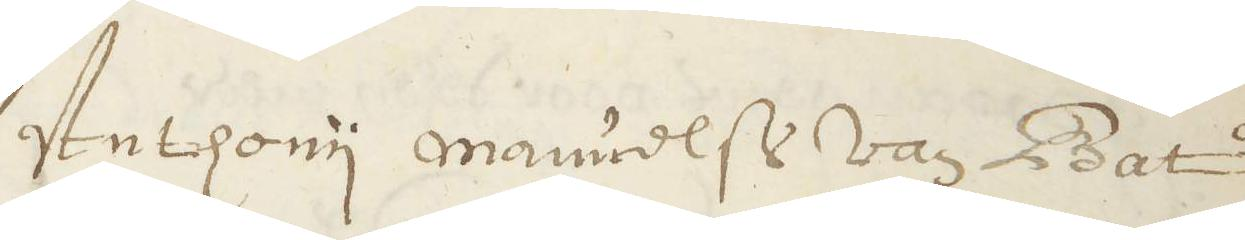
Anthonij manuelsz van Bat:a
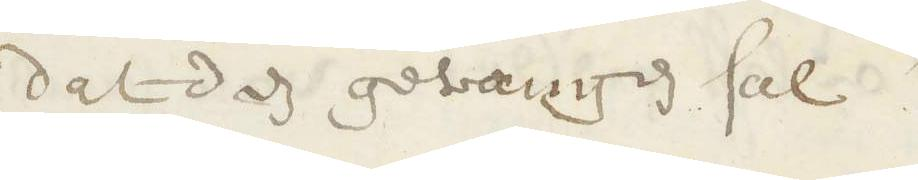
dat den gevangen sal
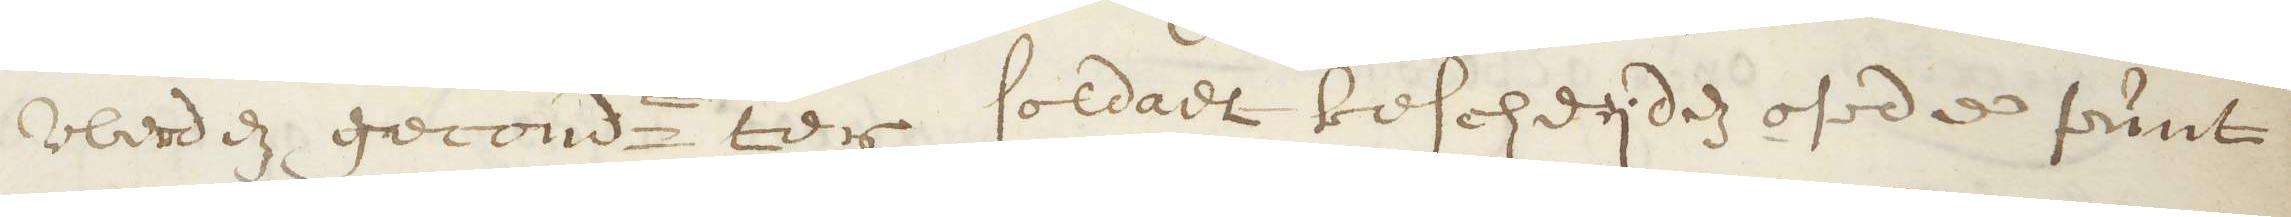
werden gecond=t ter soldaet bescheijden op de punt
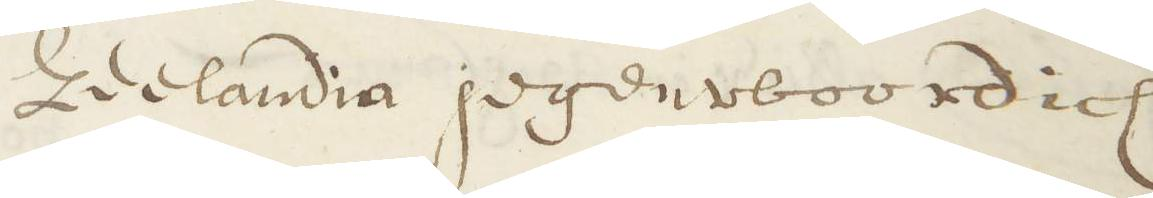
Zeelandia jegenwoordich
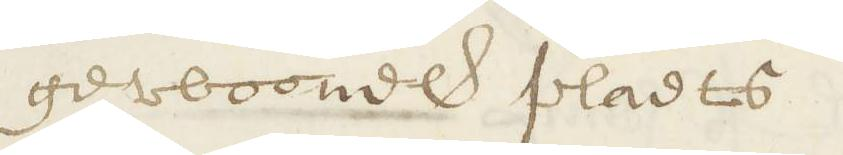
gewoonelijk plaets
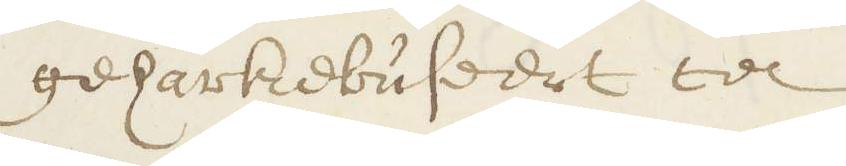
geharkebuseert te
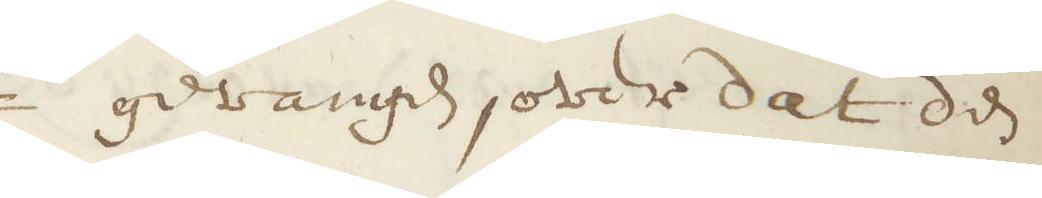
S' H=res gevangen, over dat den
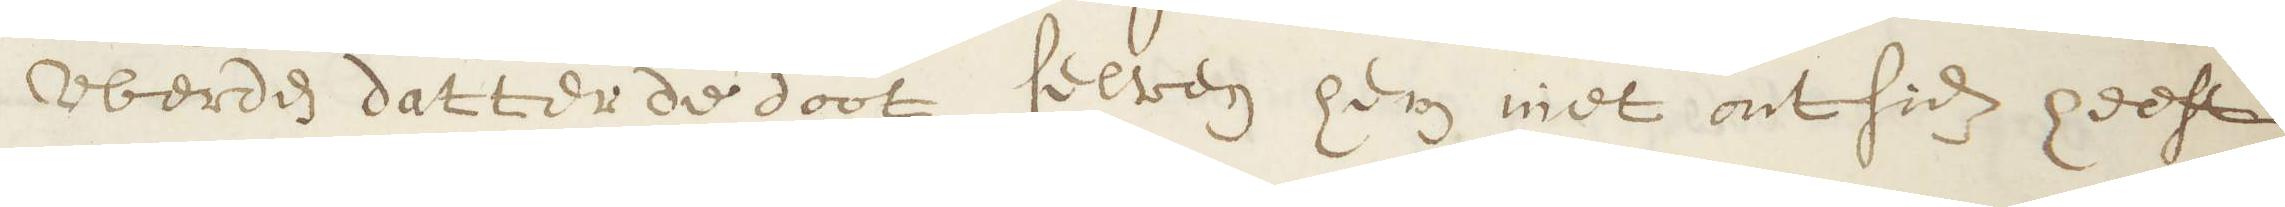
werden datter de doot selven hem niet ontsien heeft
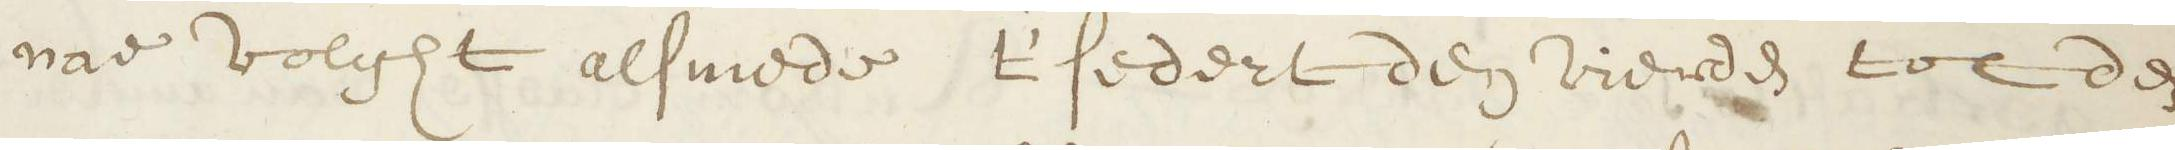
nae volght alsmede t' sedert den vierden tot den
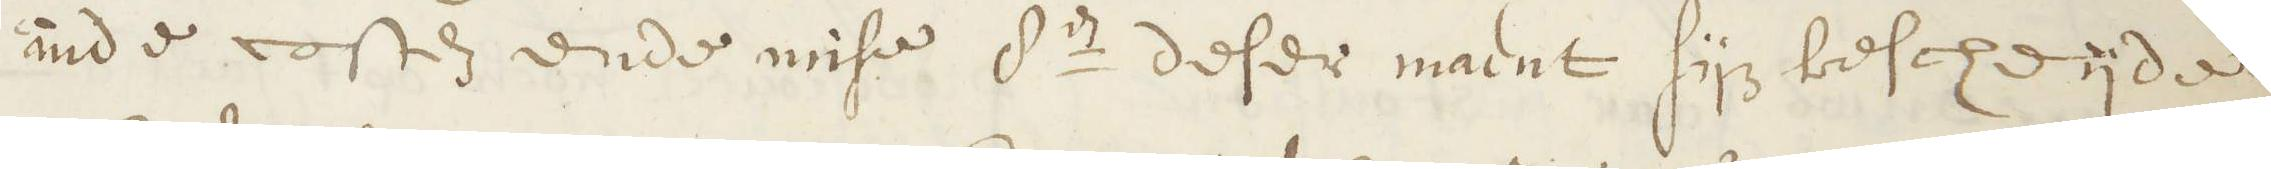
inde costen ende mise 8=en deser maent sijn bescheijde
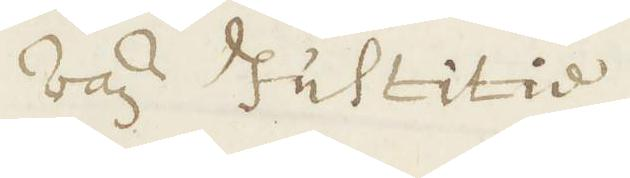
van Justitie
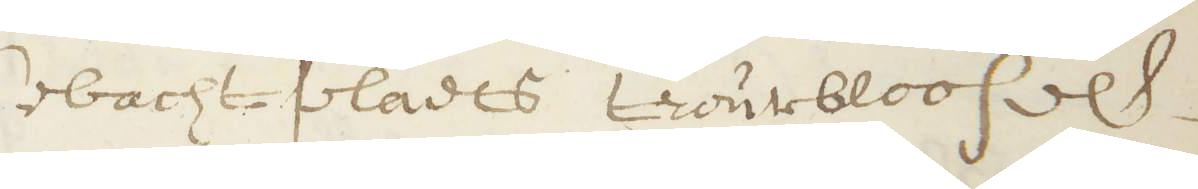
wachtplaets trouwlooselijk
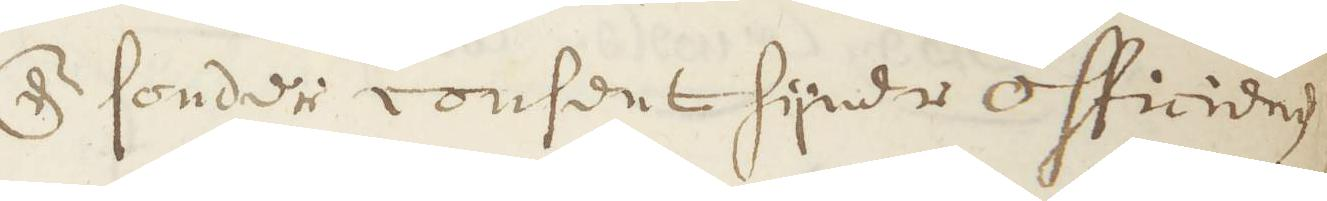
enden sonder consent sijner officieren
